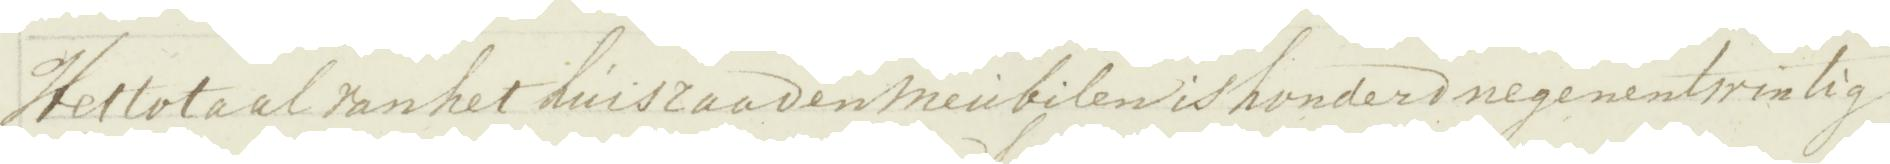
Het totaal van het huisraad en Meubilen is honderd negenentwintig
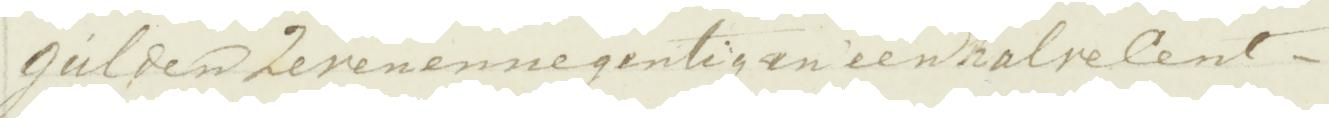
gulden zevenennegentig en een halve Cent - - - - - - - - ƒ 129 97½
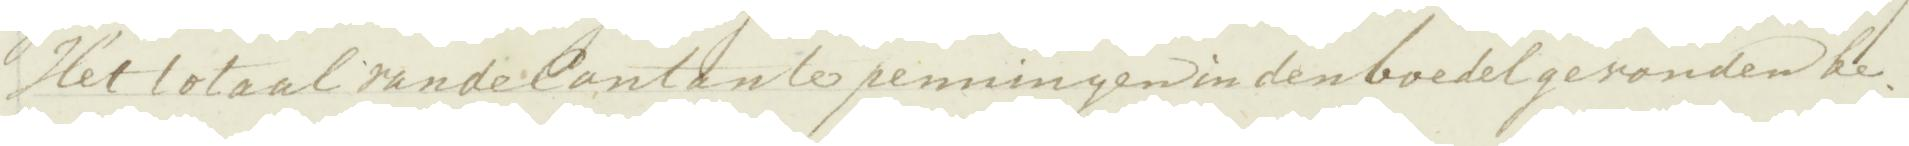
Het totaal van de Contante penningen in den boedel gevonden be,
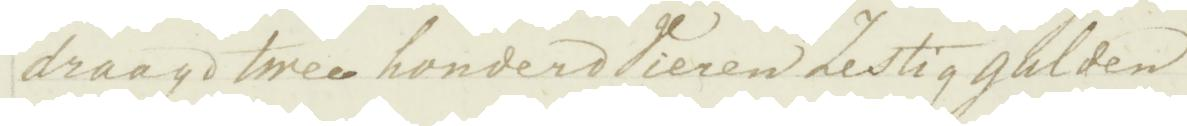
draagd twee honderd Vieren Zestig gulden . . . . . . . . . . . „ 264. —
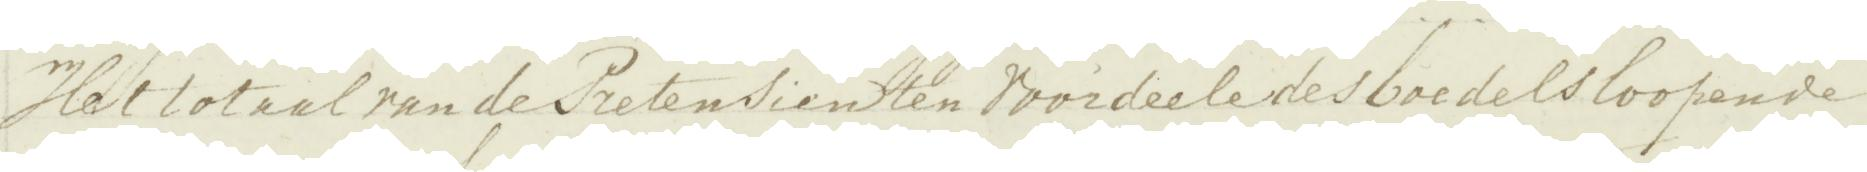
Het totaal van de Pretensien ten Voordeele des boedels loopende
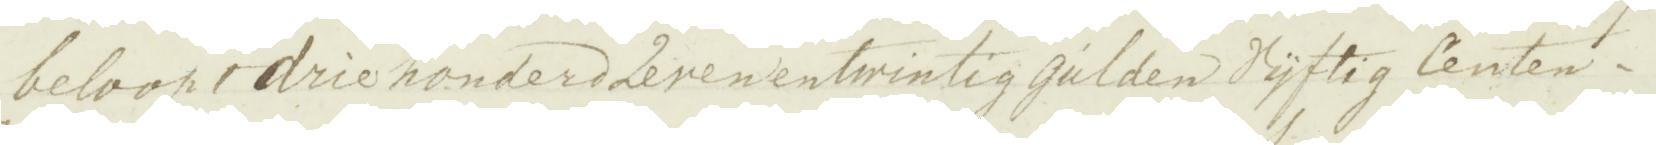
beloopt drie honderd Zeven en twintig gulden Vijftig Centen . . . . „ 327.50.
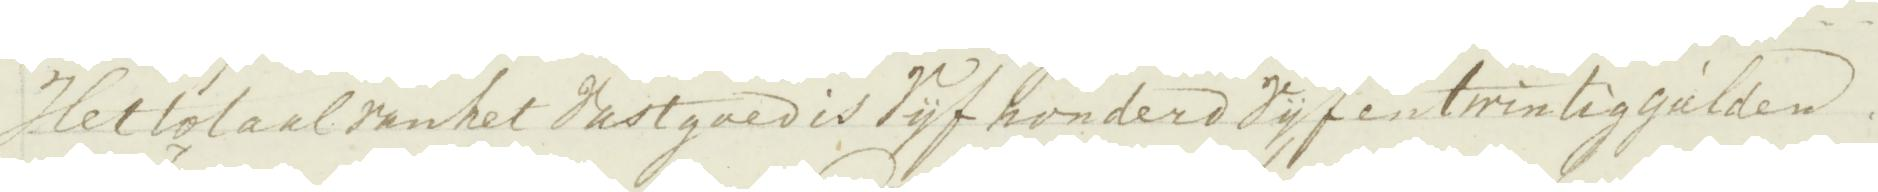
Het totaal van het Vastgoed is Vijf honderd Vijf en twintig gulden . . 525. —
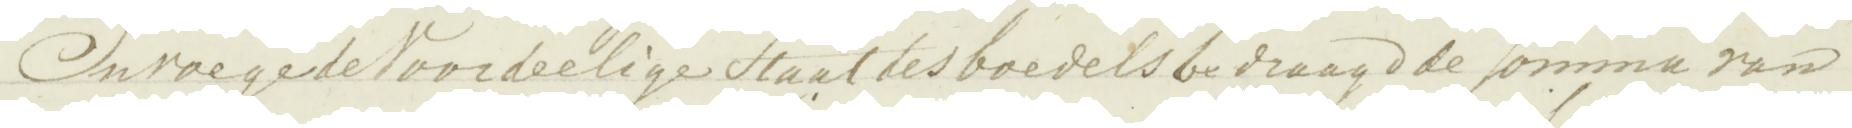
Jnvoege de Voordeelige staat des boedels bedraagd de somma van
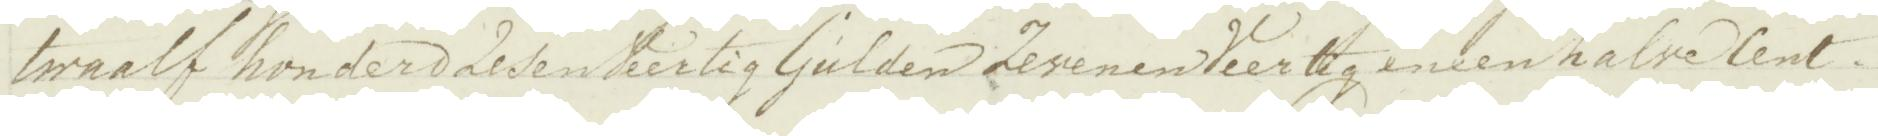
twaalf honderd Zes en Veertig Gulden Zevenen Veertig en een halve Cent . . ƒ1246. 47½
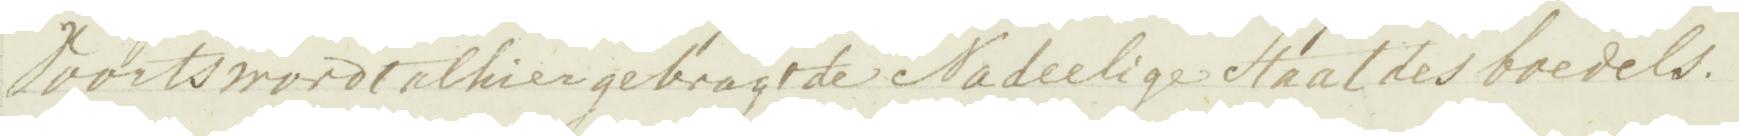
Voorts wordt alhier gebragt de Nadeelige staat des boedels.
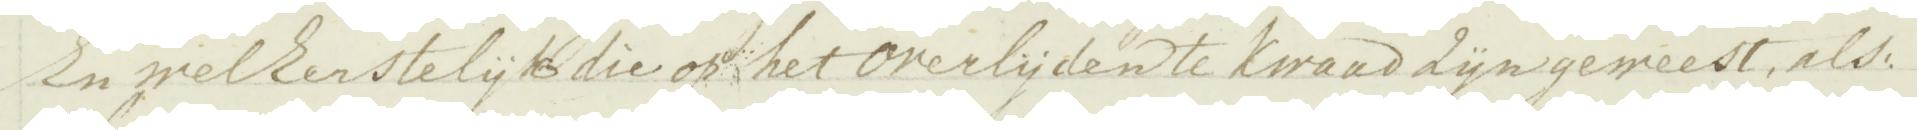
En wel Eerstelijk die op het overlijden te kwaad zijn geweest, als„
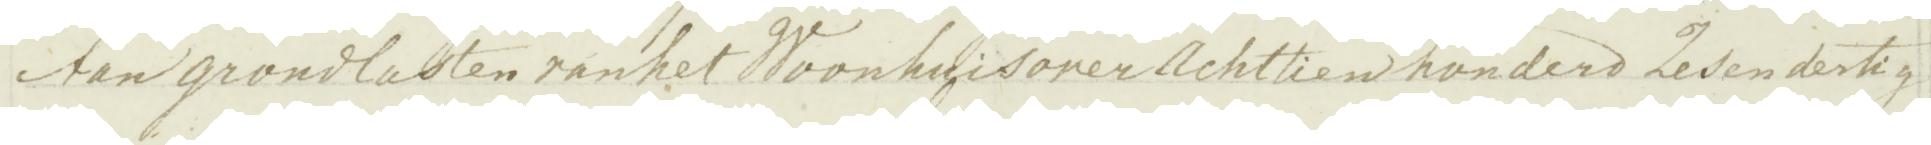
Aan grondlasten van het Woonhuis over Achttien honderd Zes en dertig
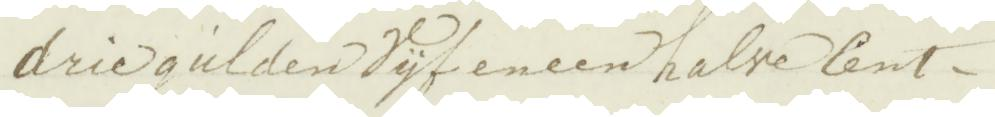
drie gulden Vijf en een halve Cent . . . . . . . . . . ƒ 3.05½
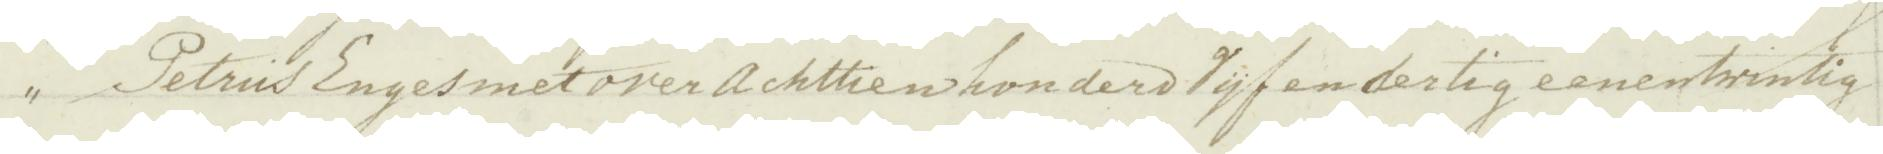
„ Petrus Engesmet over Achttien honderd Vijf en dertig eenentwintig
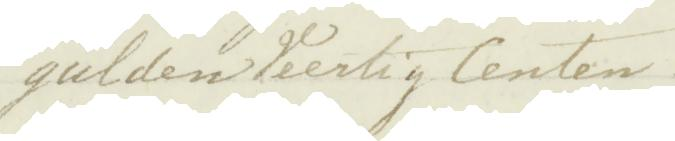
gulden Veertig Centen . . . . . . . . . . . . . . . „ 21.40
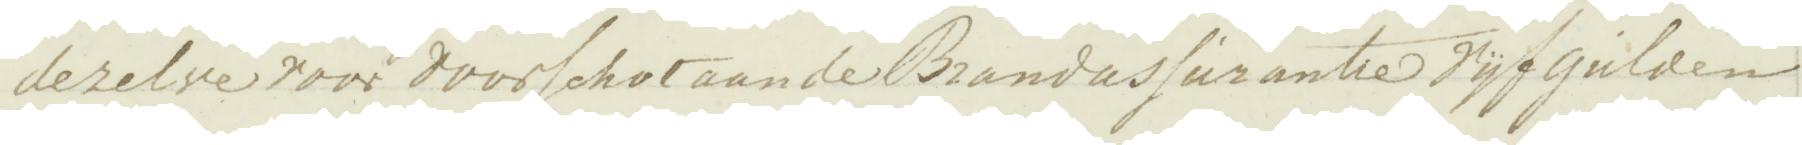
dezelve voor voorschot aan de Brandassurantie Vijf gulden
